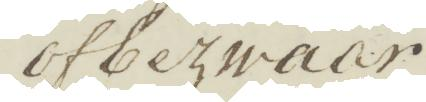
of bezwaar.
